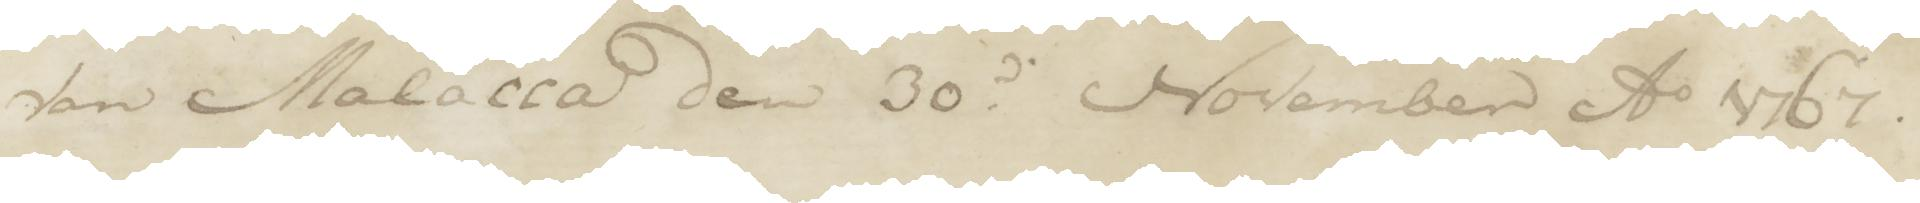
van Malacca den 30:' November Ao 1767.
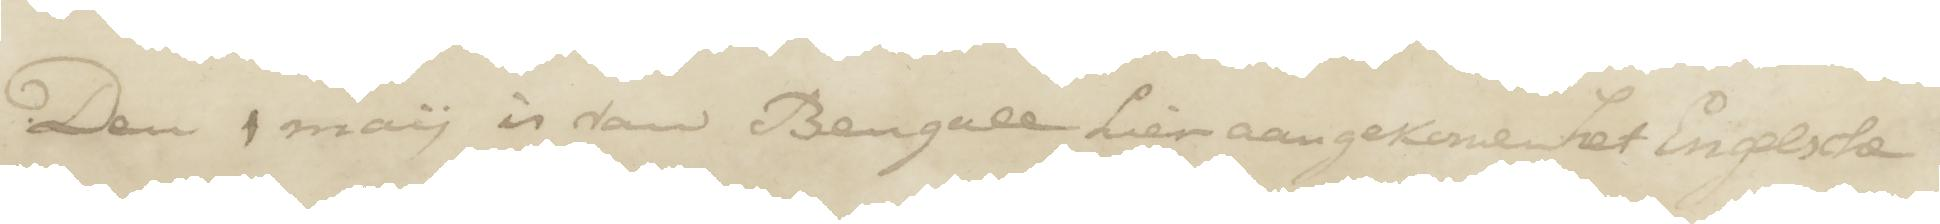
Den 1 maij is van Bengale hier aangekomen het Engelsche
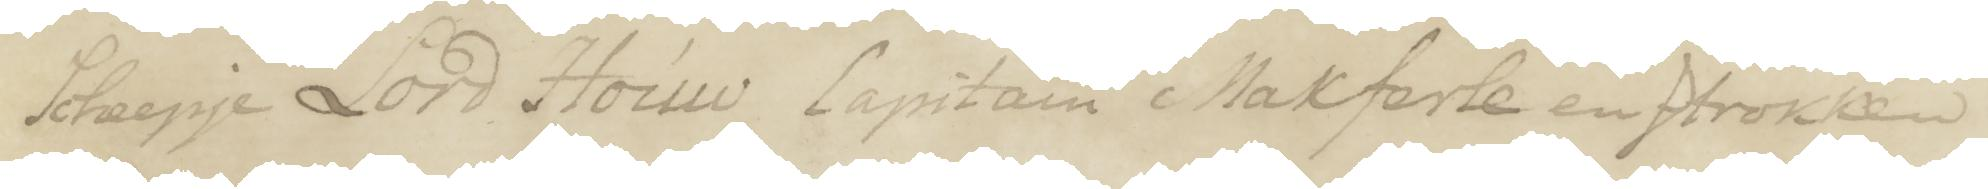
scheepje Lord Houw Capitain Makferle en vertrokken
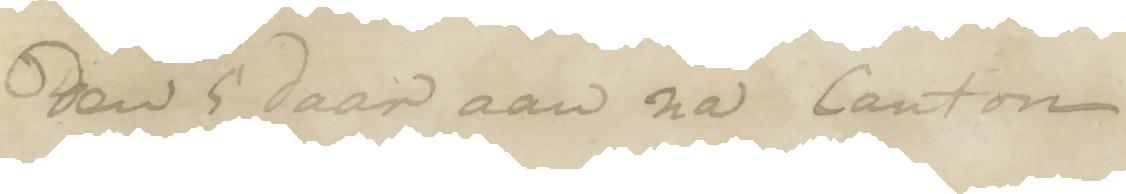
den 5 daar aan na Canton
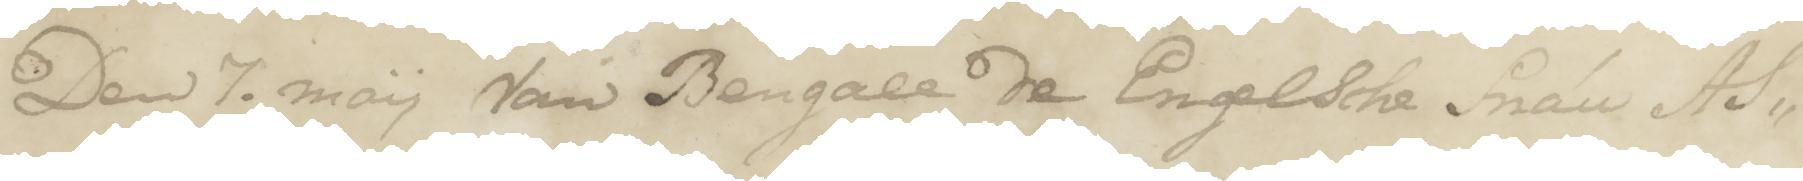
Den 7. maij van Bengale de Engelsche Snau As„
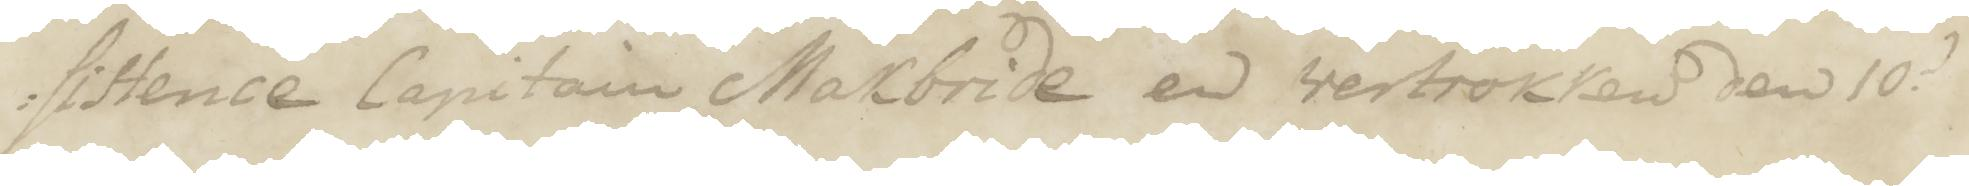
sistence Capitain Makbride en vertrokken den 10:'
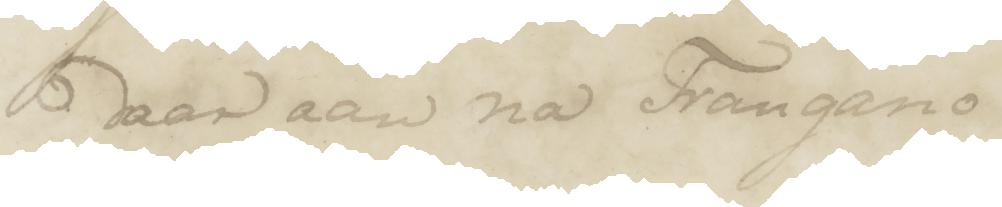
daar aan na Trangano
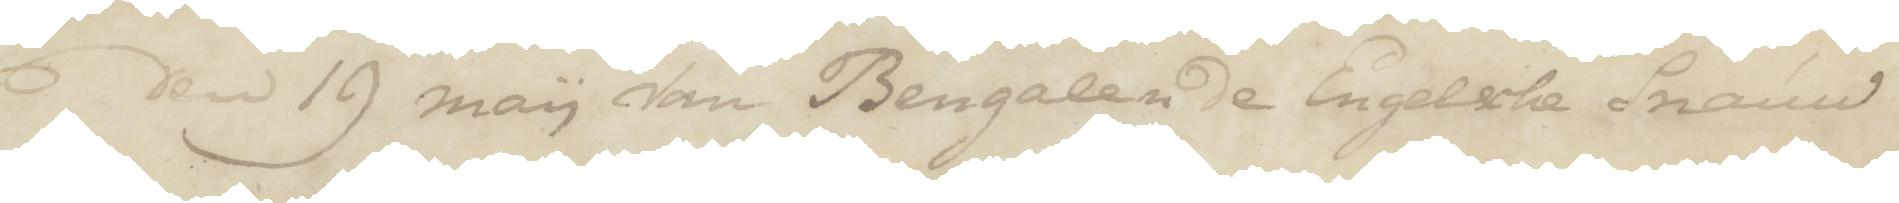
den 19 maij van Bengalen de Engelsche snauw
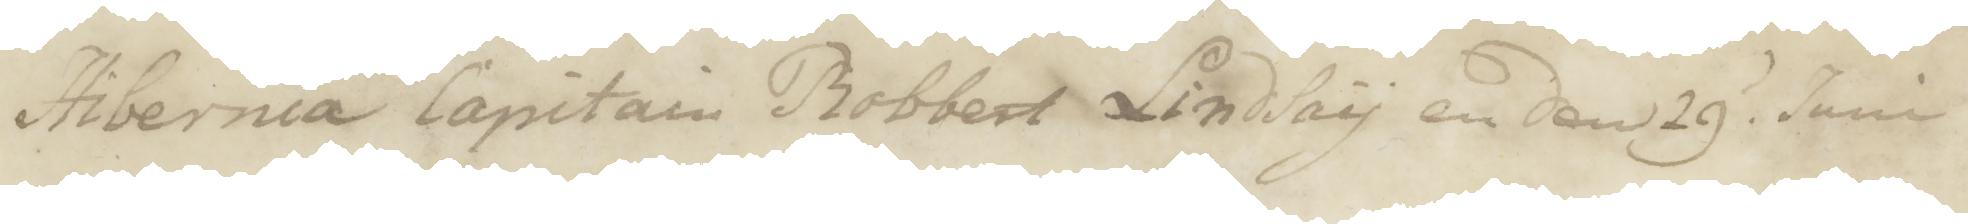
Hibernia Capitain Robbert Lindsaij en den 29.' Juni
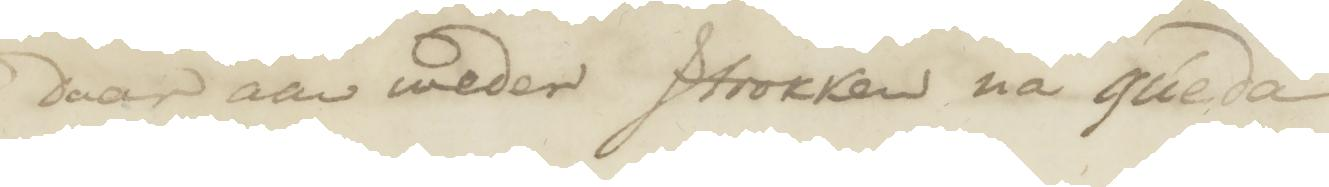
daar aan weder vertrokken na queda
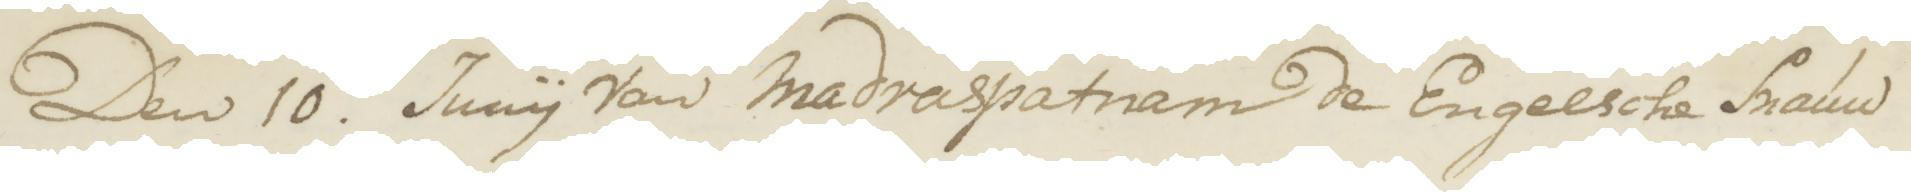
Den 10.' Junij van madraspatnam de Engelsche Snauw
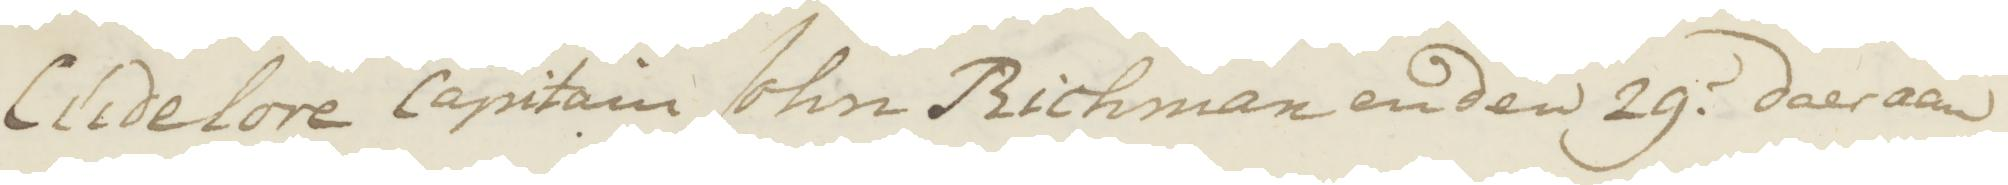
Cudelore Capitain John Richman en den 29:' daer aan
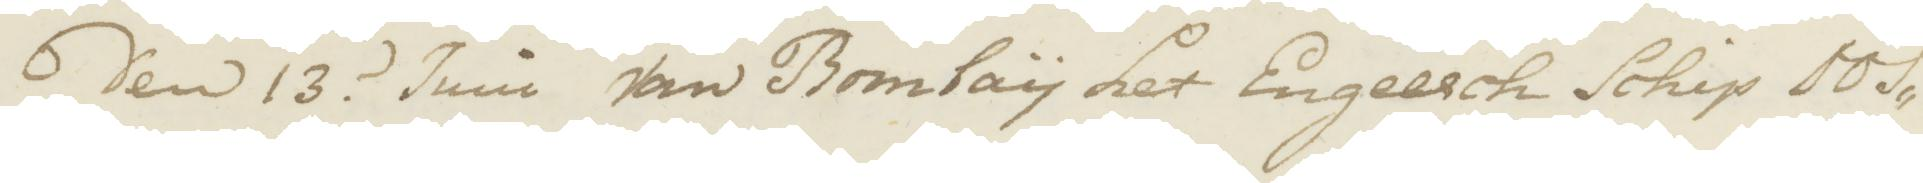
den 13.' Juni van Bombaij het Engelsch schip oos„
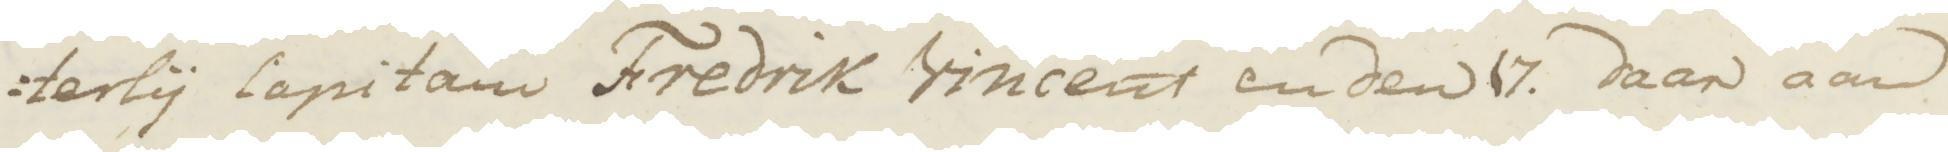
:terlij Capitain Fredrik Vincent en den 17. daar aan
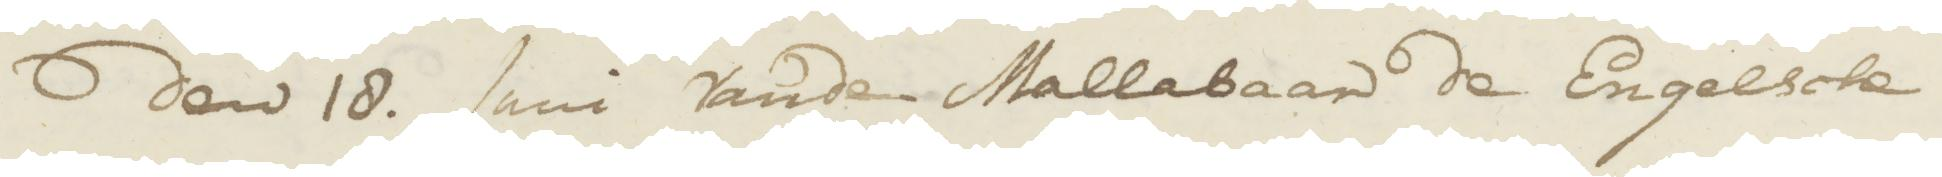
den 18. Juni van den Mallabaar de Engelsche
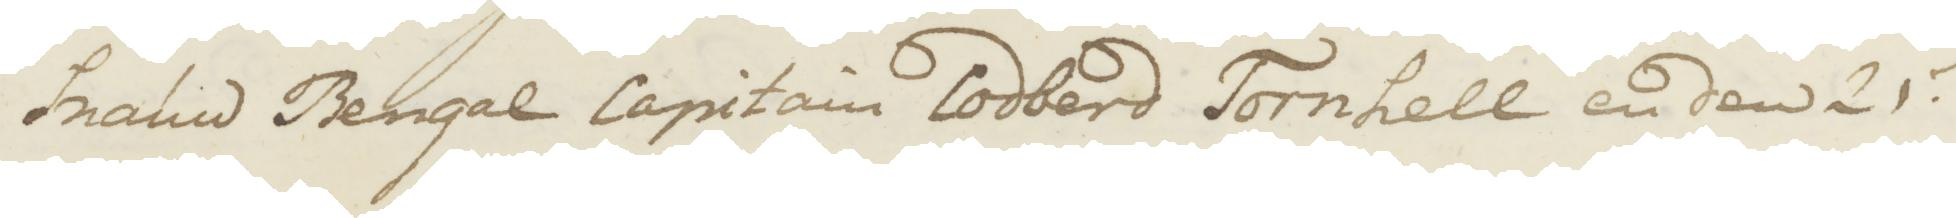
snauw Bengal Capitain Codberd Tornhell en den 21:'
